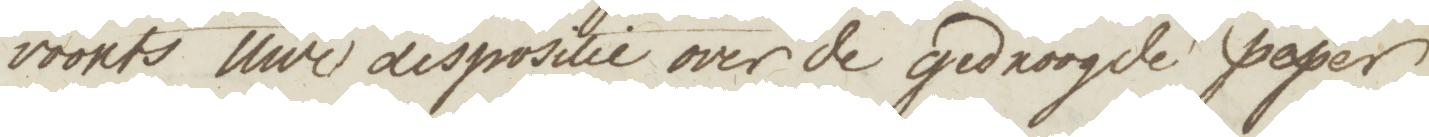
voorts uwe dispositie over de gedroogde peper
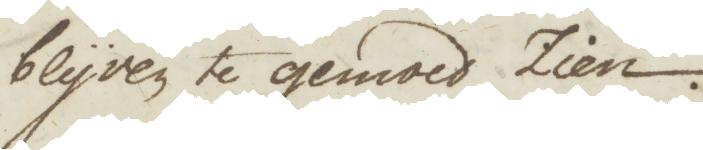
blijven te gemoed zien.
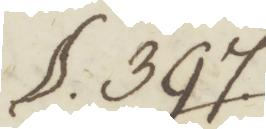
§. 397.
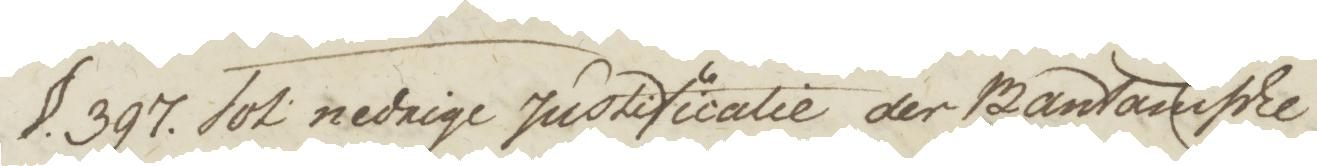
§. 397. tot nedrige Justificatie der Bantamsche
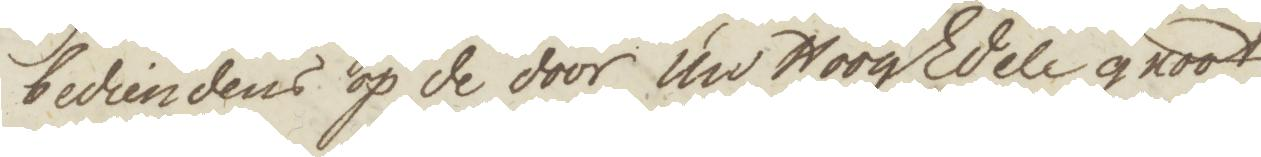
bediendens op de door uw Hoog Edele groot
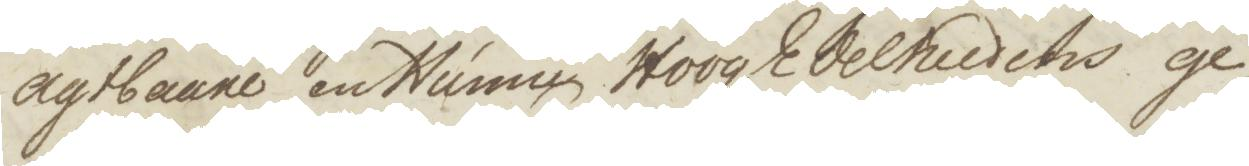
agtbaare en Hunnen Hoog Edelheedens ge
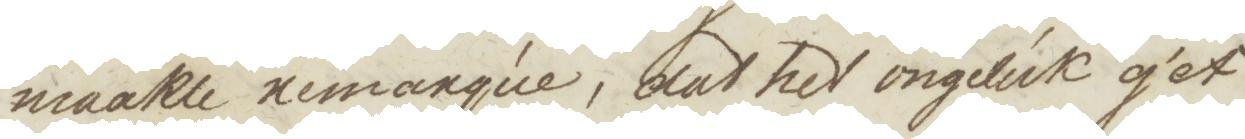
maakte remarque, dat het ongeluk g'ex
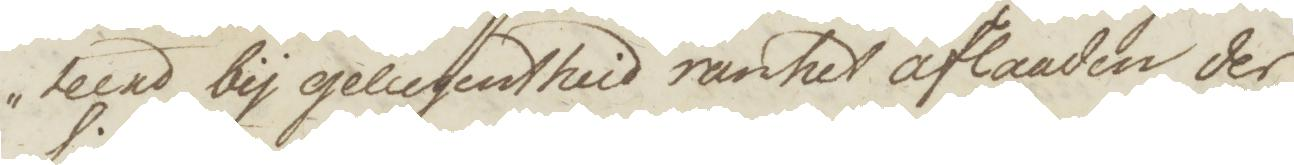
„teerd bij geleegentheid van het aflaaden der
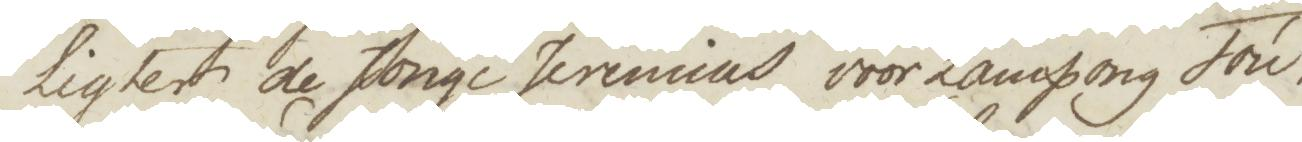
Ligter de Jonge Jeremias voor Lampong Tou
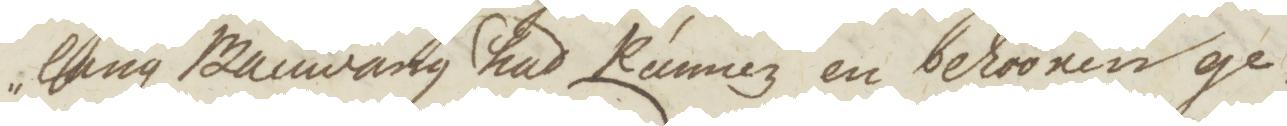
„lang Bauwang had kunnen en behooren ge„
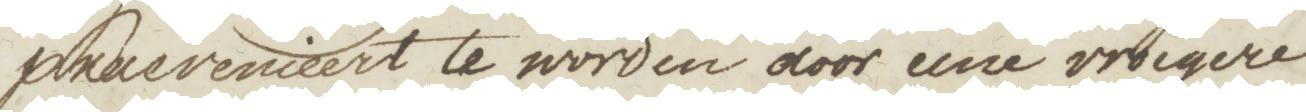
praevenieert te worden door eene vroegere
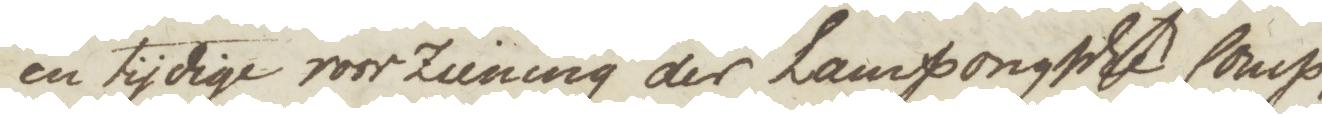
en tijdige voorziening der Lampongsche Comp„
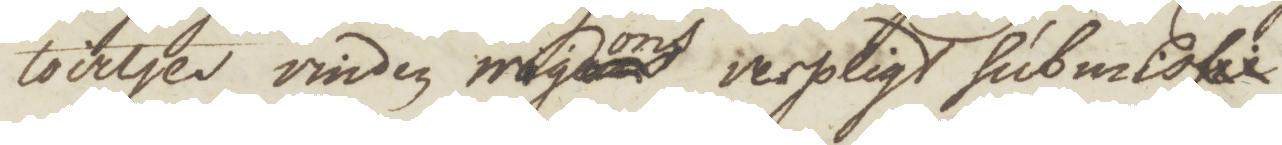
toirtje vinden wij ons verpligt submissie
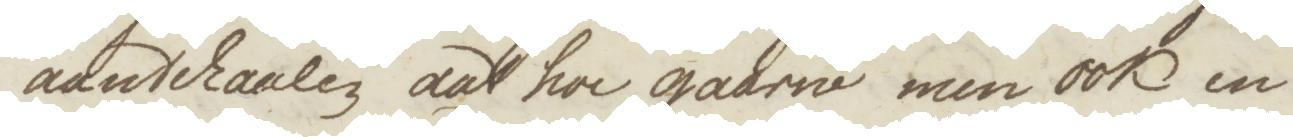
aantehaalen dat hoe gaarne men ook in
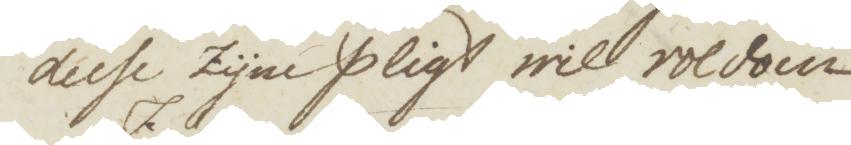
deese zijne pligt wil voldoen.
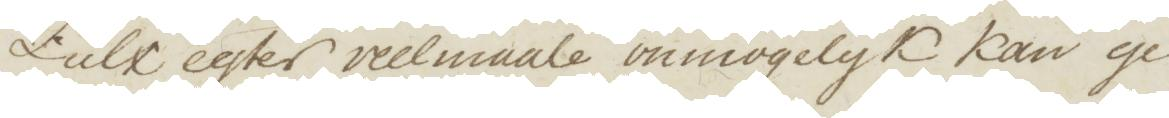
Zulx egter veelmaale onmogelijk kan ge
